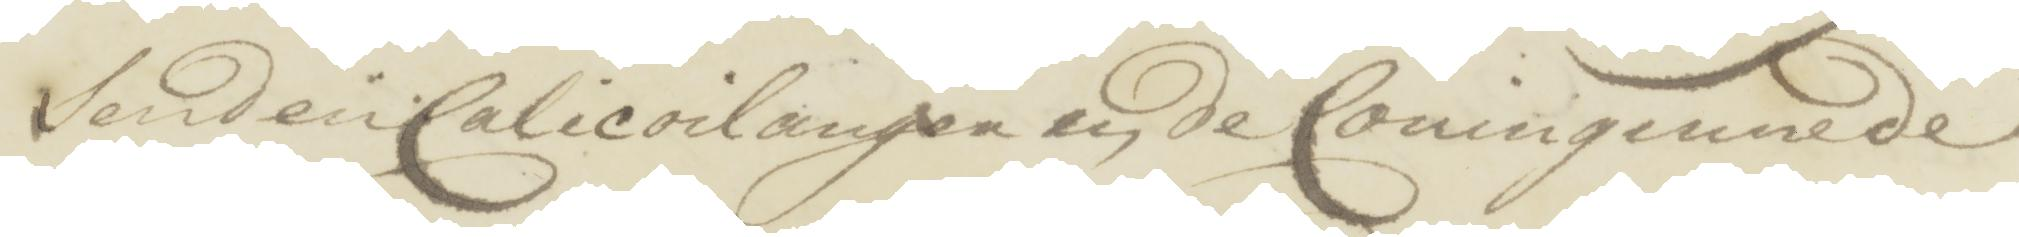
sen den Calicoilanger en de Coninginne de
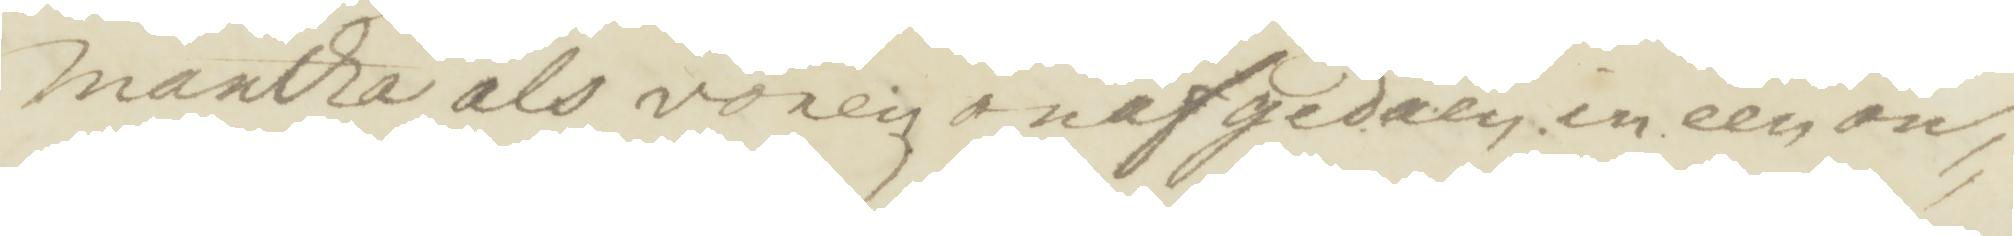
martha als voren onafgedaen in een on„
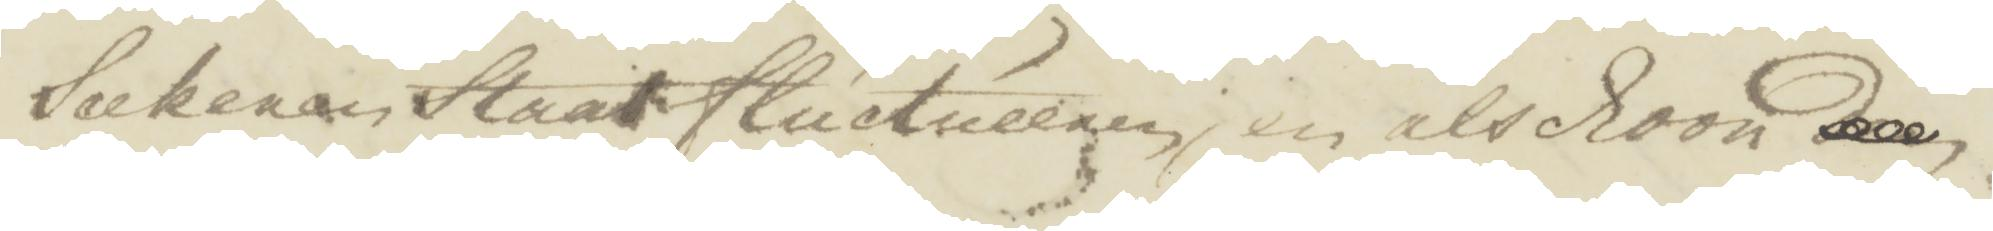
seekeren staat fluctueeren, en alschoon den
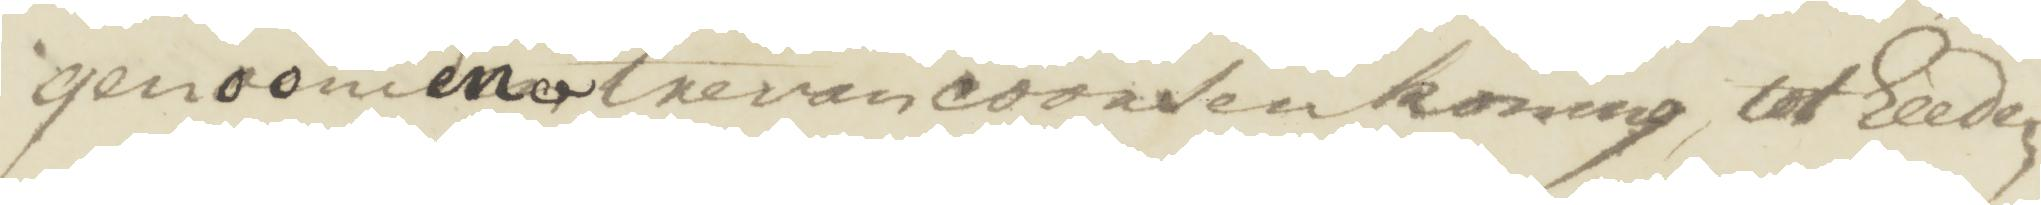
genoomen trevancoorsen koning, tot heeden
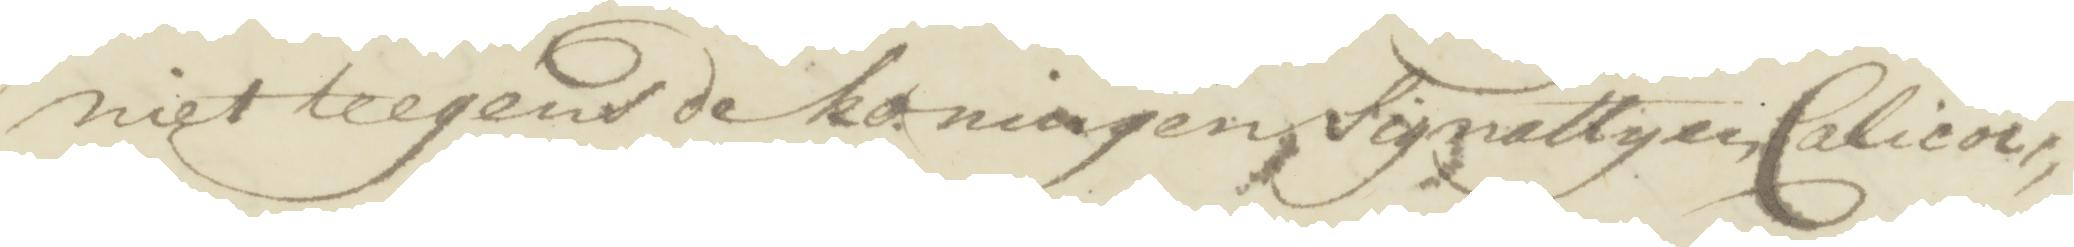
niet teegens de koningen signatty en Calicoi„
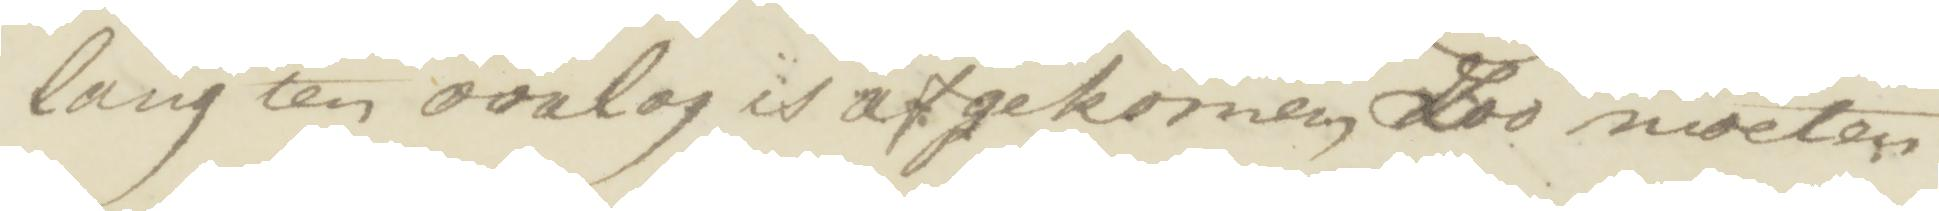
lang ten oorlog is afgekomen zoo moeten
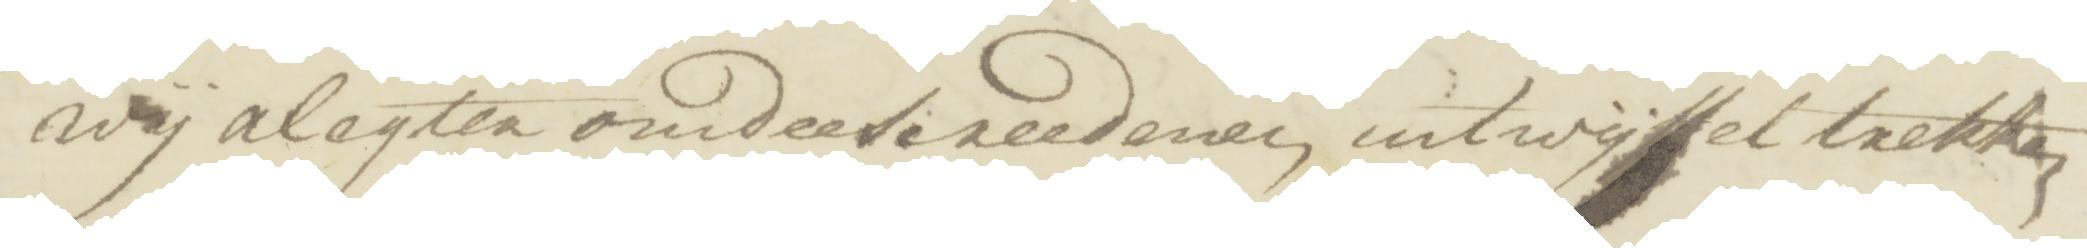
wij alegter om deese reedenen intwijffel trekken
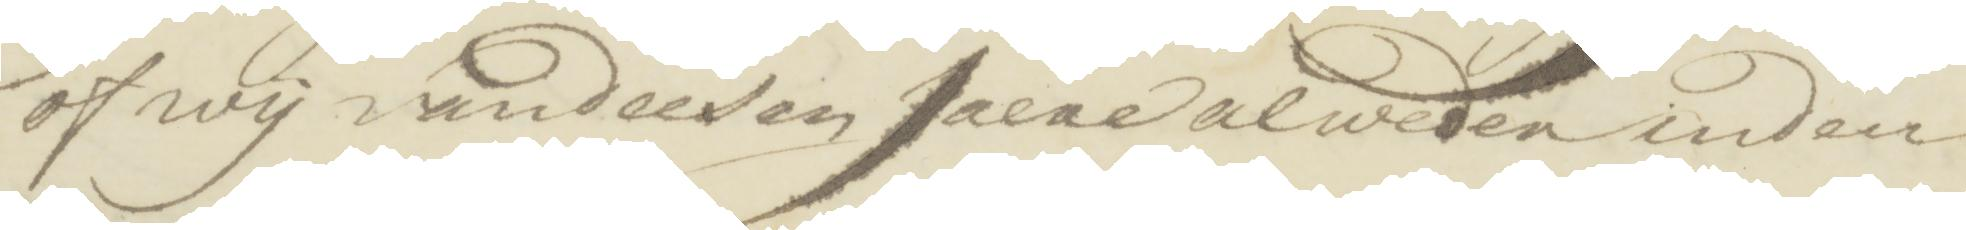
of wij van deesen jaere alweder in den
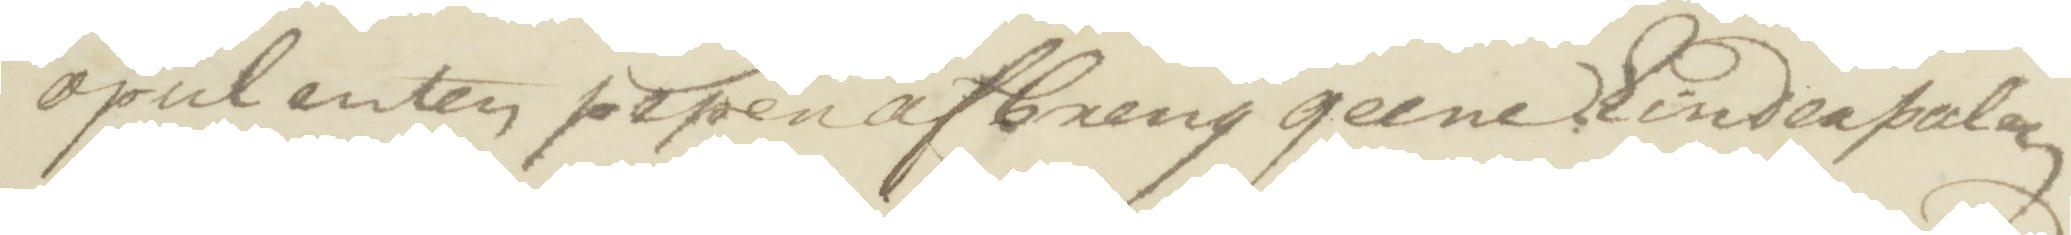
opulenten peper afbreng geene hinderpalen
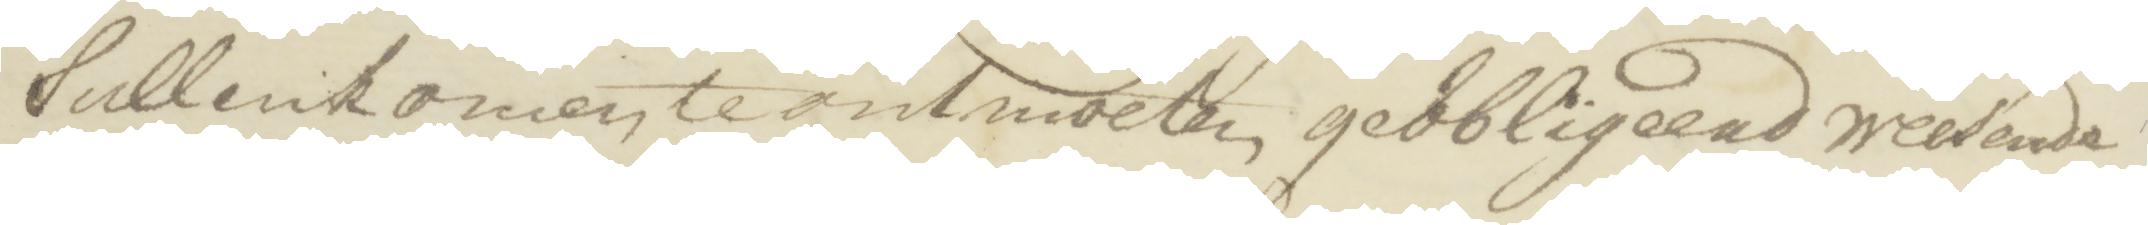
sullen komen te ontmoeten geobligeerd weesende
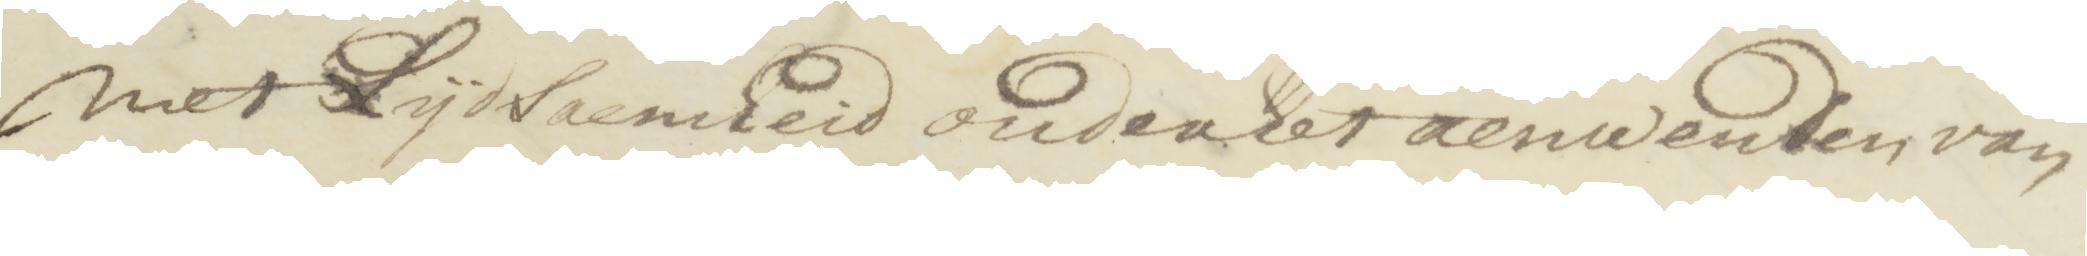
met Lijdsaemheid onder het aenwenden van
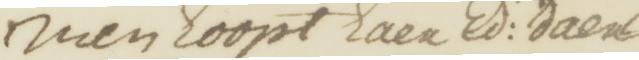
men hoopt haer Ed: daer
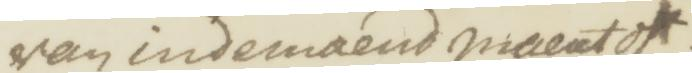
van inde maend maert of
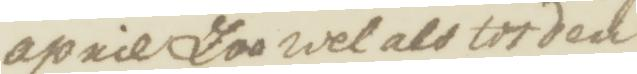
april zoo wel als tot den
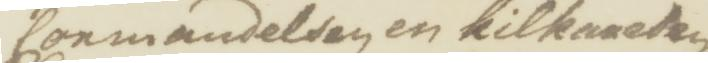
Cormandelsen en kilkaresen
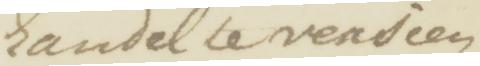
handel te versien
